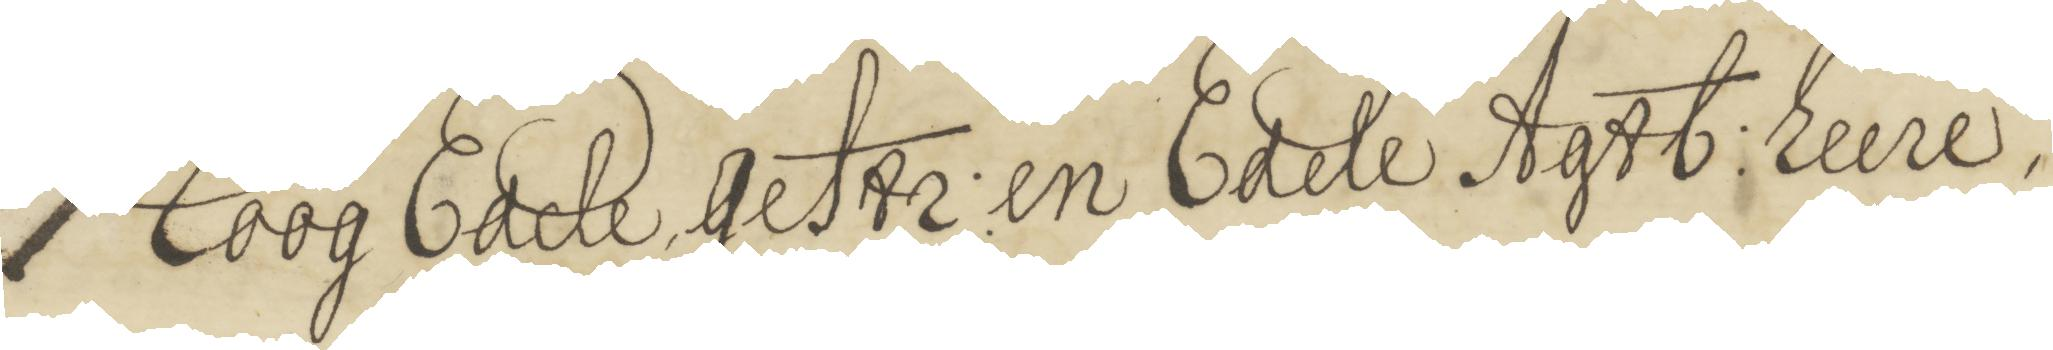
Hoog Edele, gestr: en Edele Agtb: heere,
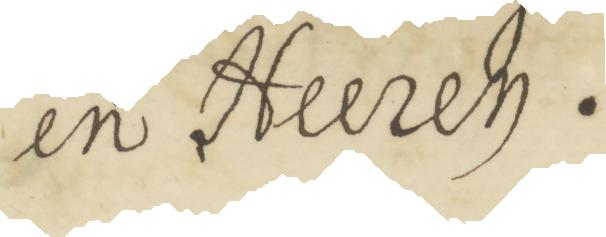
en Heeren.
